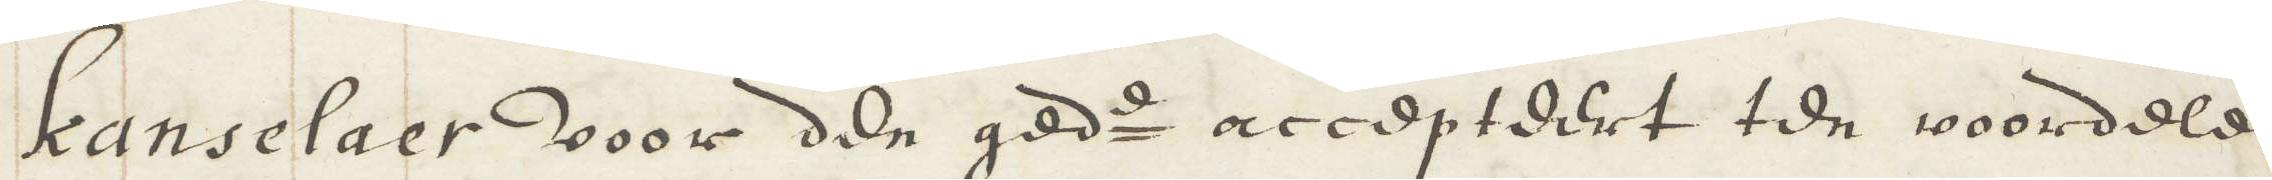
kanselaer voor den ged=e accepteert ten voordele
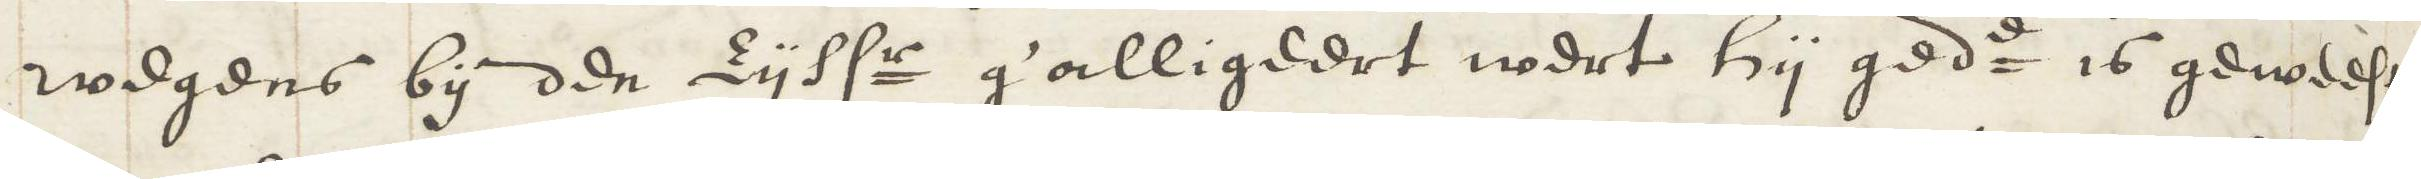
wegens bij den Eijss=r g’alligeert wert hij ged=e is geweest
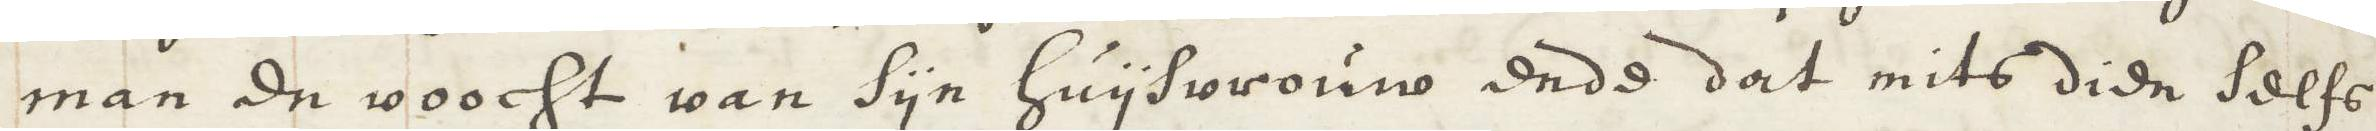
man en voocht van sijn huijsvrouw ende dat mits dien selfs
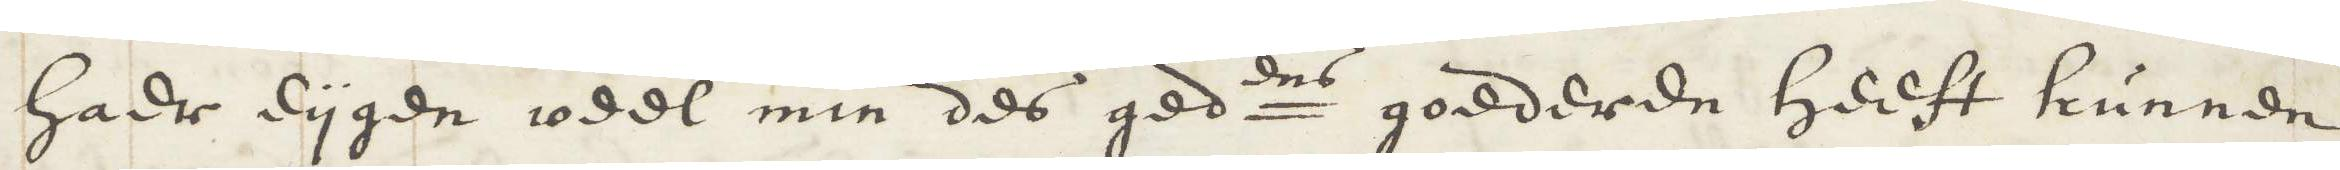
haer eijgen veel min des ged=ens goederen heeft kunnen
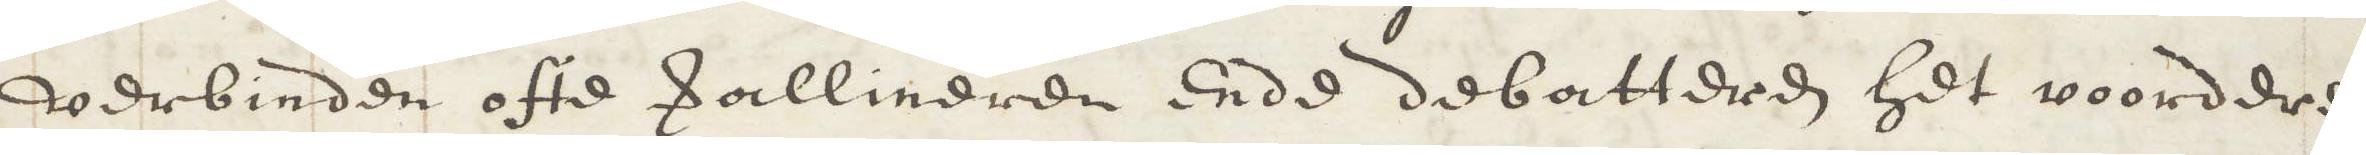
verbinden ofte verallineren ende debatteren het voordere
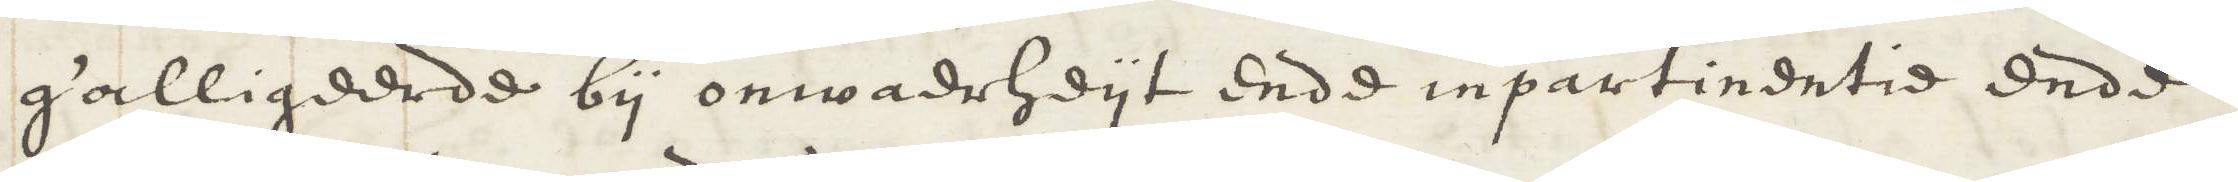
g’alligeerde bij onwaerheijt ende inpartinentie ende
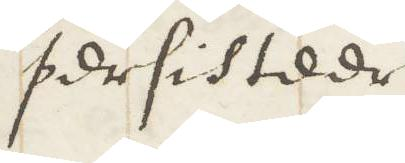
persisteert voor duplijcq.
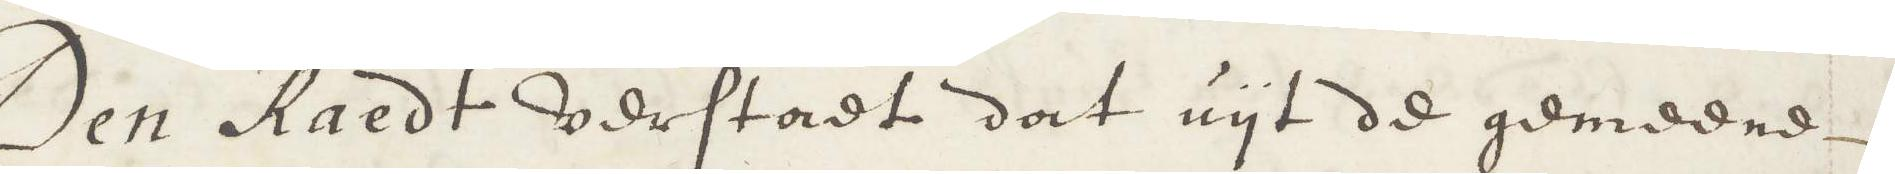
Den Raedt verstaet dat uijt de gemeene
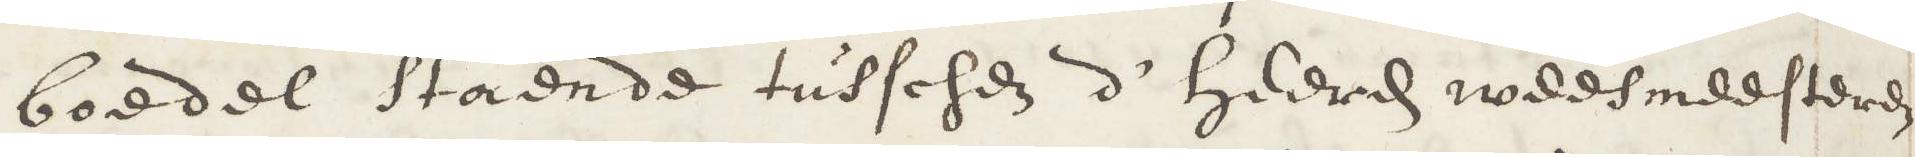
boedel staende tusschen d’ heeren weesmeesteren
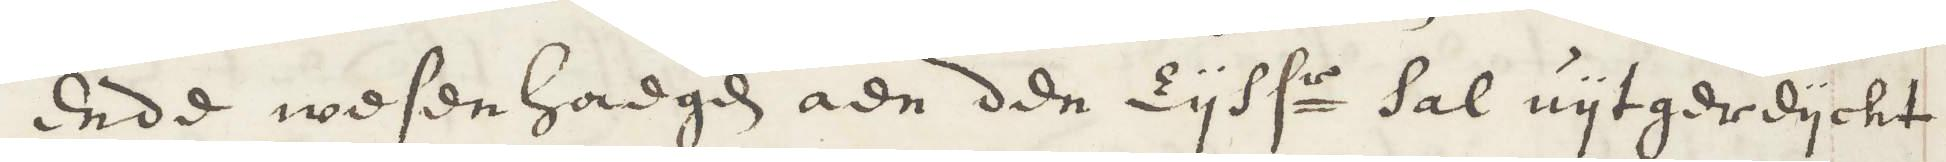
ende wesenhaegen aen den Eijss=r sal uijtgereijckt
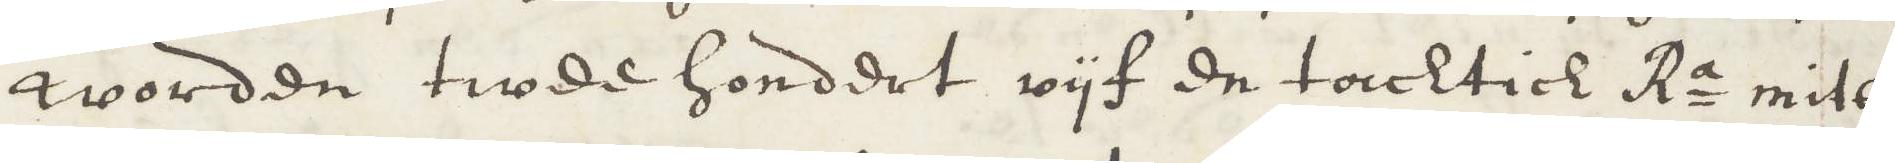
worden twee hondert vijf en tachtich R=a mits
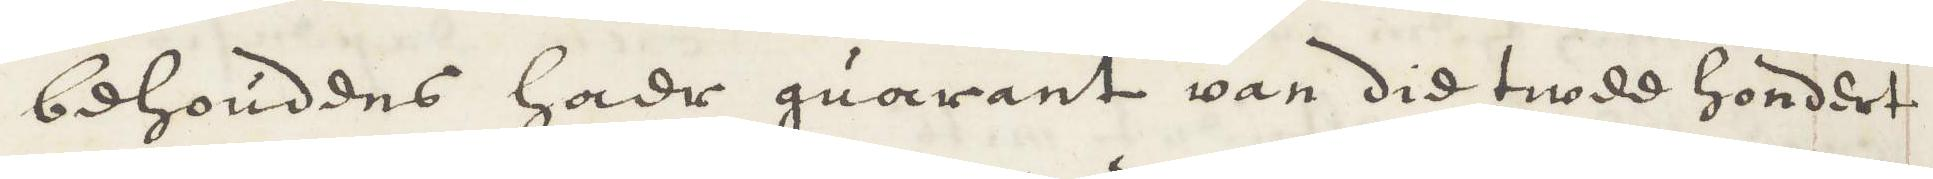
behoudens haer guarant van die twee hondert
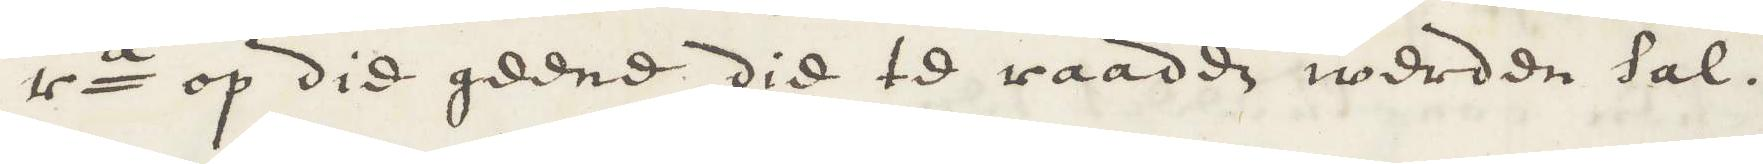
r=a op die geene die te raaden werden sal.
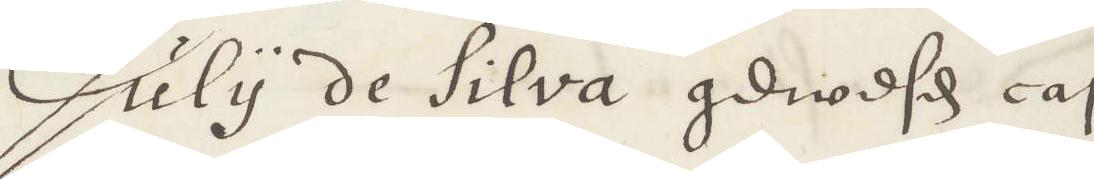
Julij de silva gewesen cap=teijn
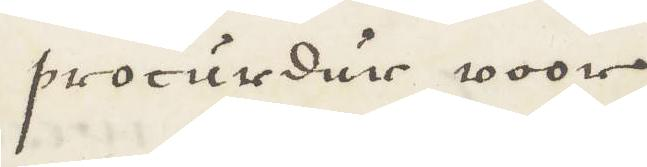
procureur voor
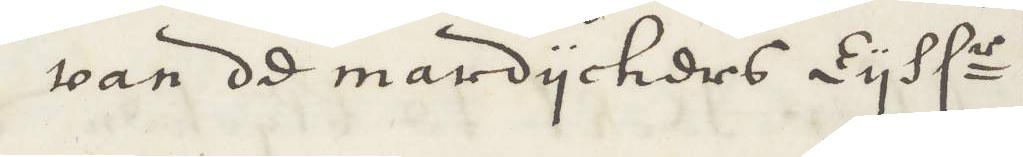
van de mardijckers Eijss=r
